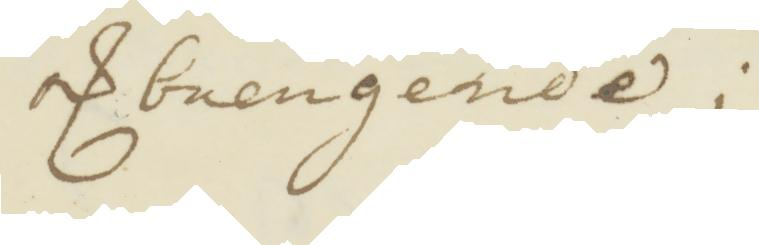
overbrengende;
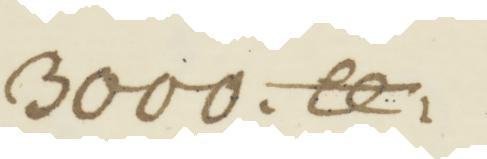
3000. lb:
